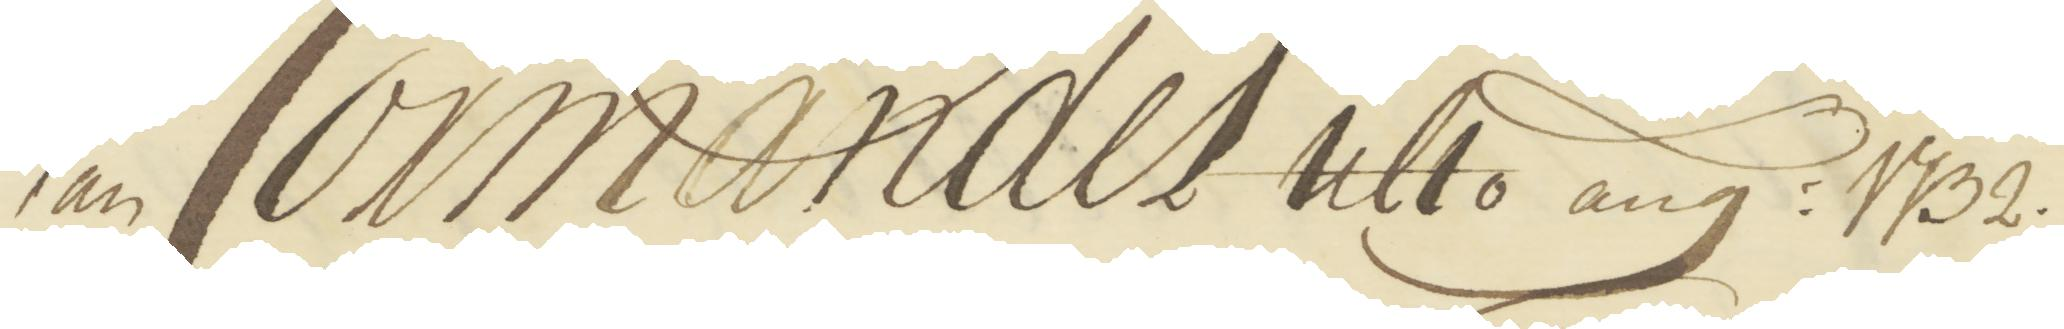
Van Cormandel ulto aug: 1732.
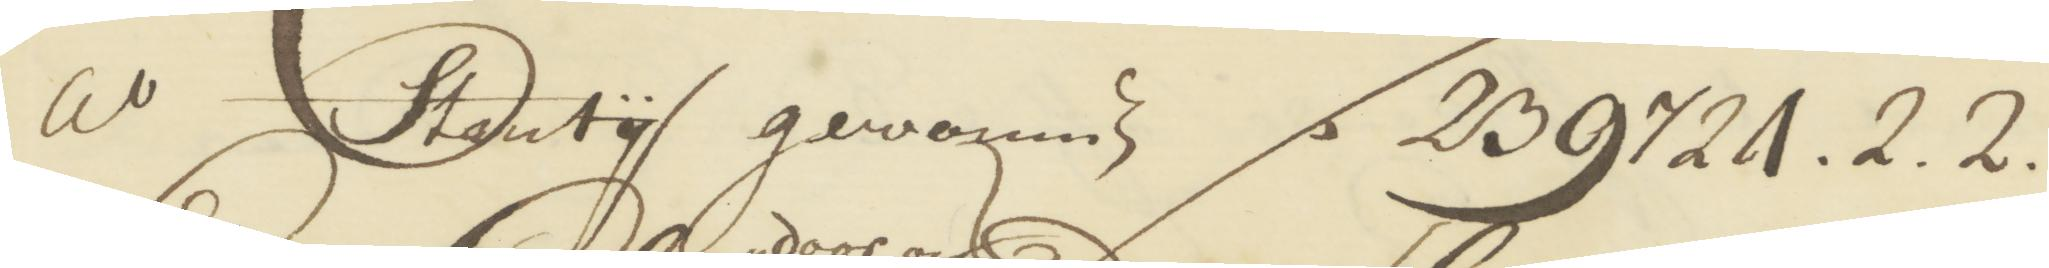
Ao Stantij gewonnen ƒ 239724.2.2.
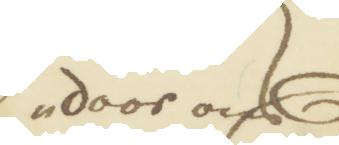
„door ons
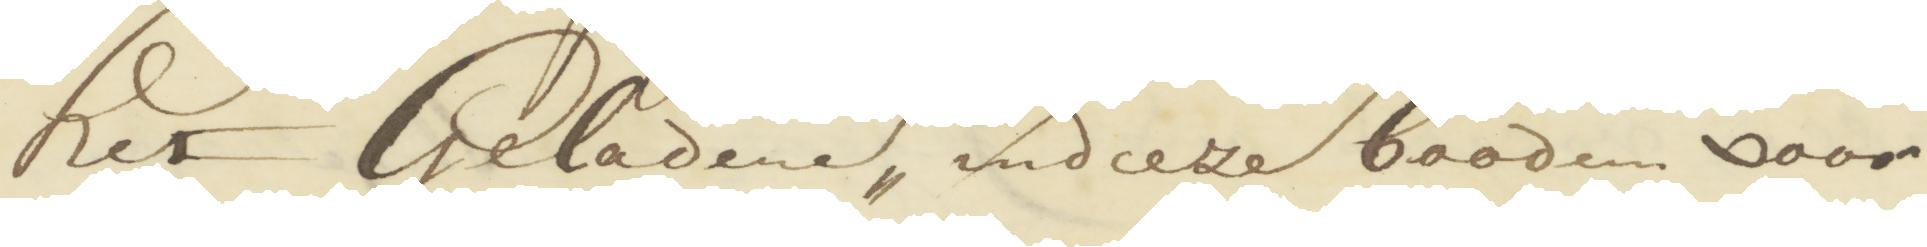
het Geladene „ in deeze boodem voor
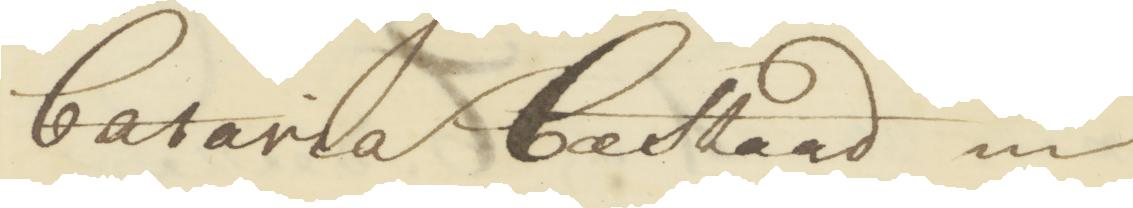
batavia bestaad in
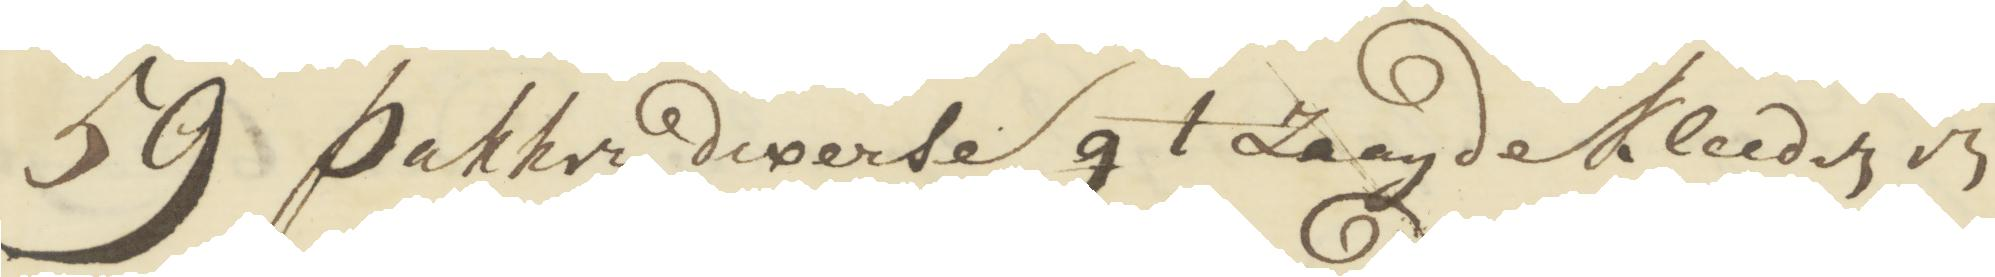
59 pakken diverse gt zaayde kleeden en
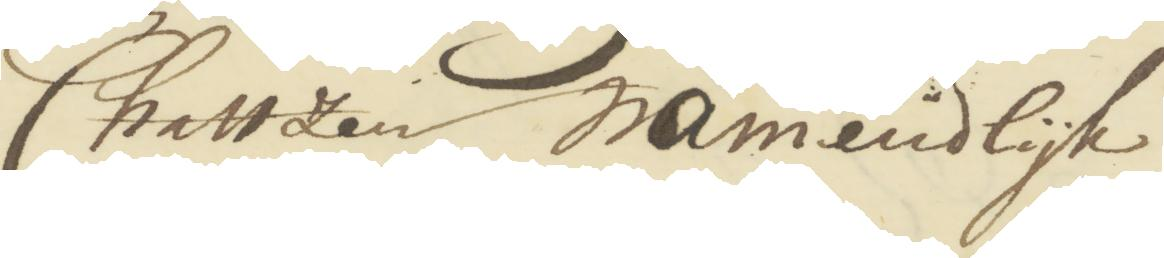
Chittzen namendlijk
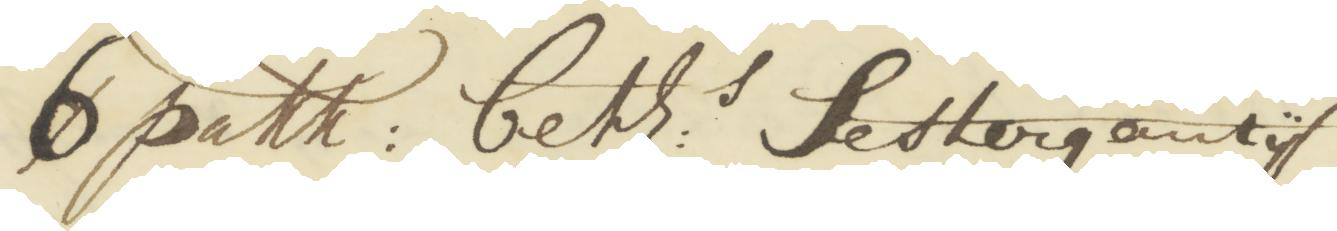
6 pakk: beth:s Sestergantij
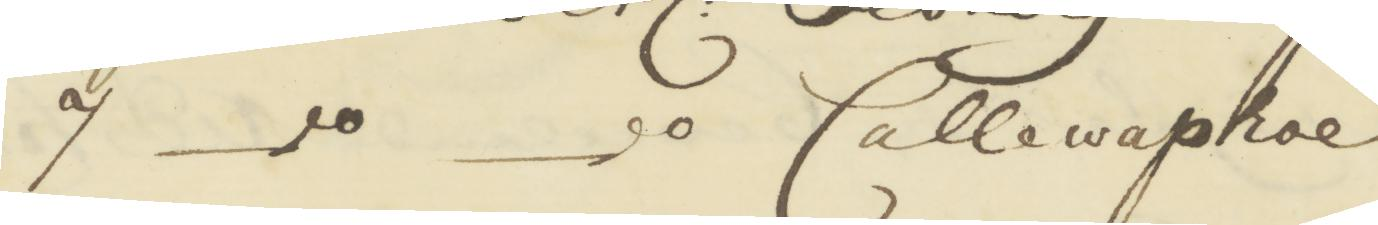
7 _o _o Callawaphoe
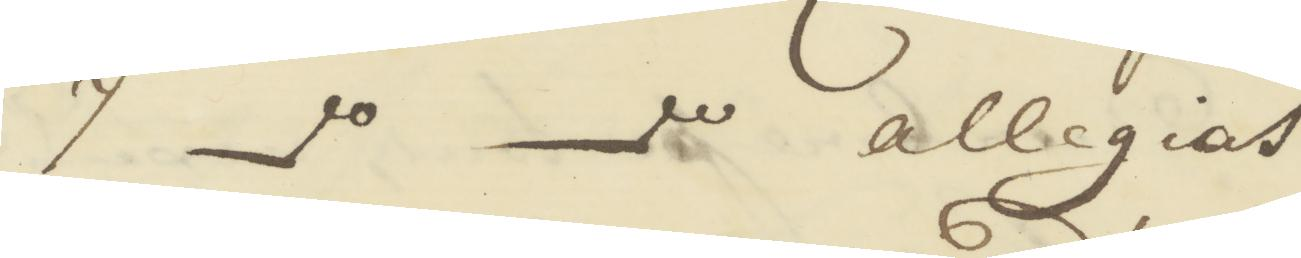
7 _o _o allegias
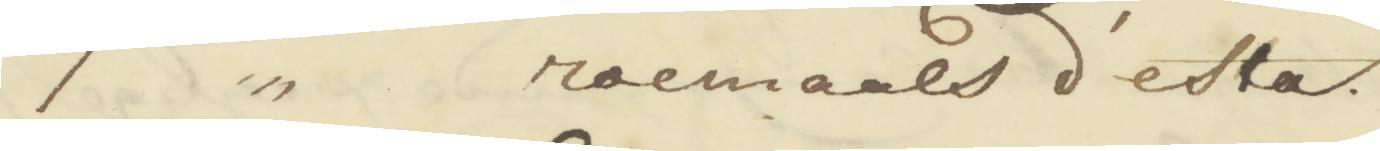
7 „ roemaals d'esta.
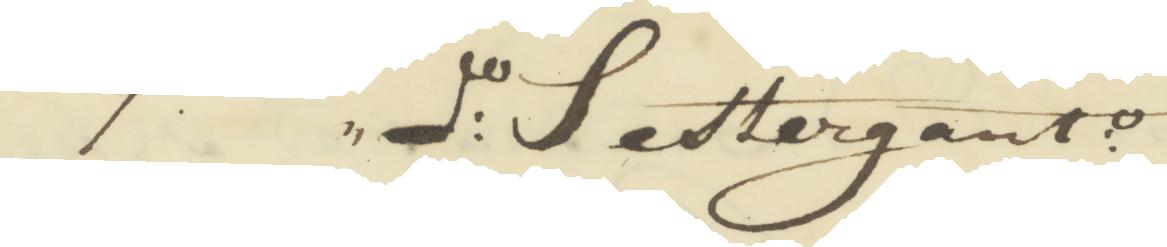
7 „ d:o Sestergant:o
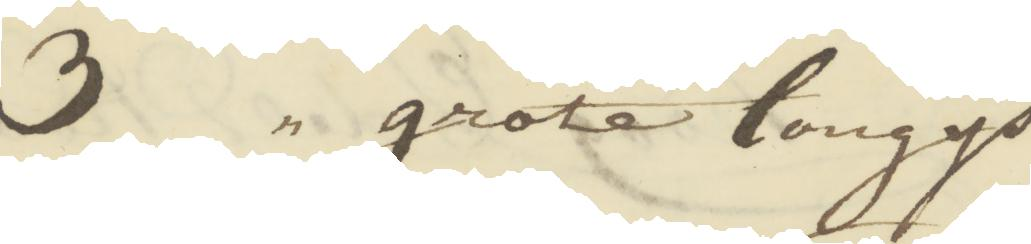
3 „ grote longijs
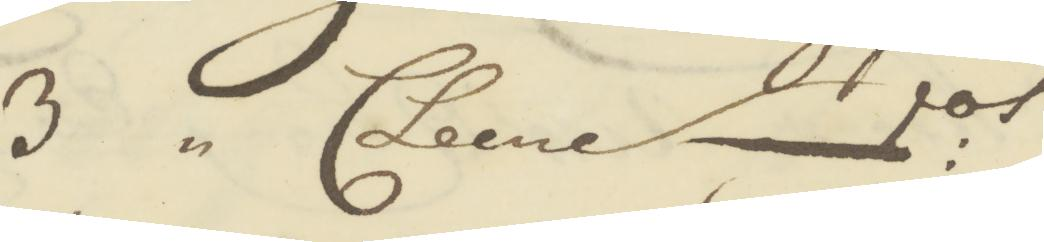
3 „ Cheene _:os
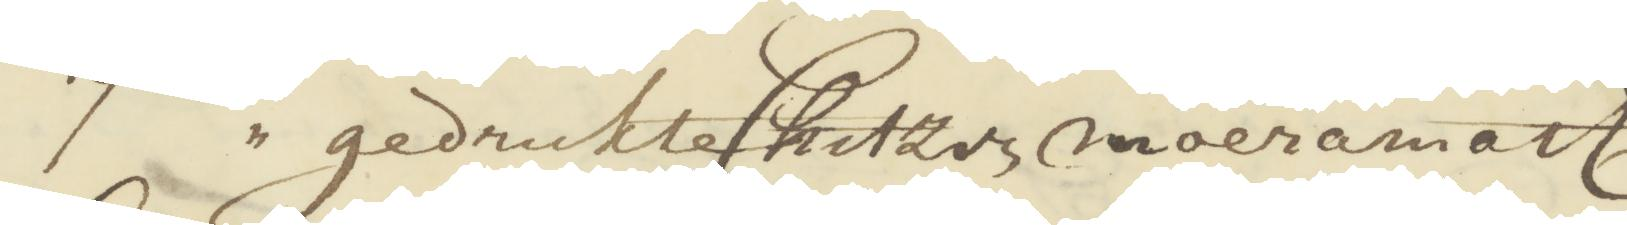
7 „ gedrukte Chitzen moeramath
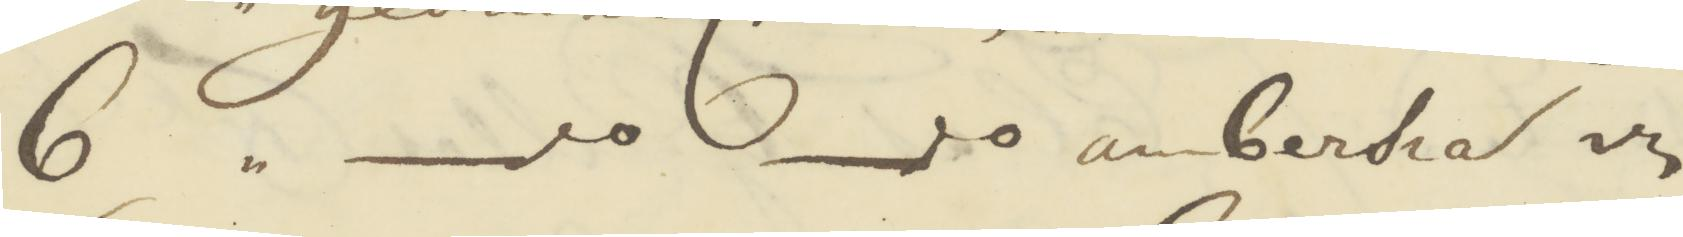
6 „ _o _o ambersia en
